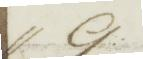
„ 9:
